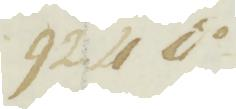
92. 4 do
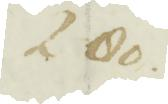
2.80.
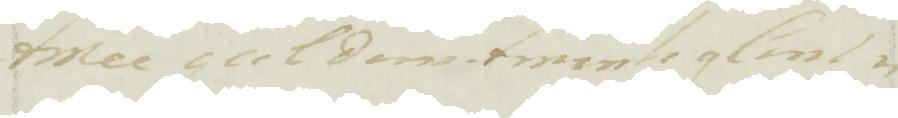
twee guldens twintig Cents
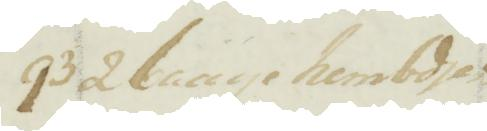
93 2 baaye hembdjes
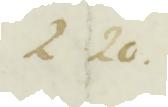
2.20.
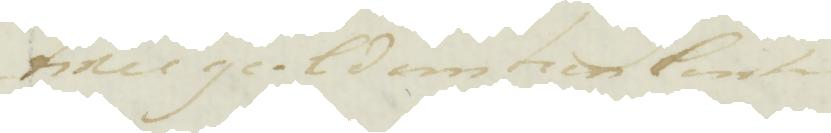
twee guldens tien Cents
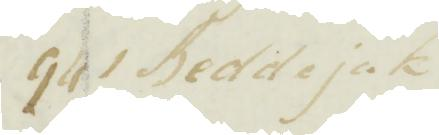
94 1 Beddejak
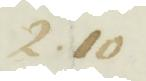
2.10
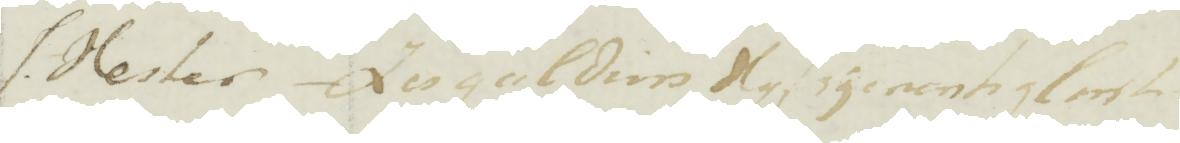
J. Hester zes guldens Vyf enzeventig Cents
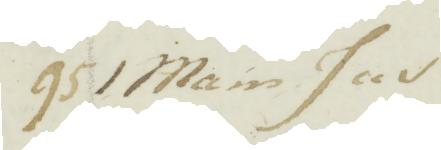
95 1 Mans Jas
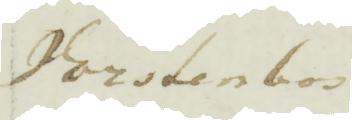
Vorstenbos
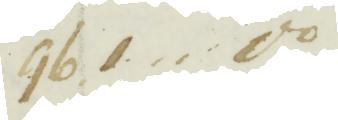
96. 1. „ do
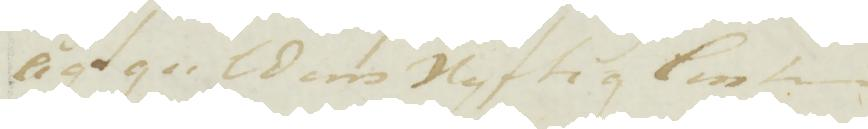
agt guldens Vyftig Cents
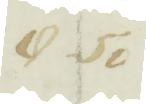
8.50
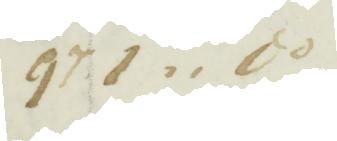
97. 1„ d:o
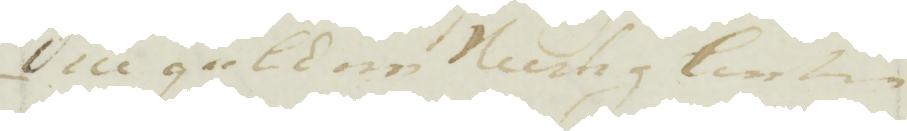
drie guldens Veertig Cents
